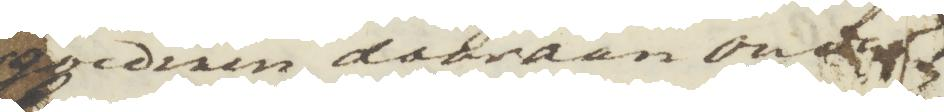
de begrooting der goederen daaraan onder
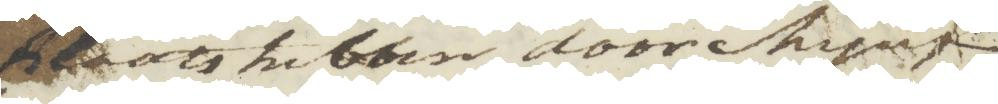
worden zal plaats hebben door Mejuf
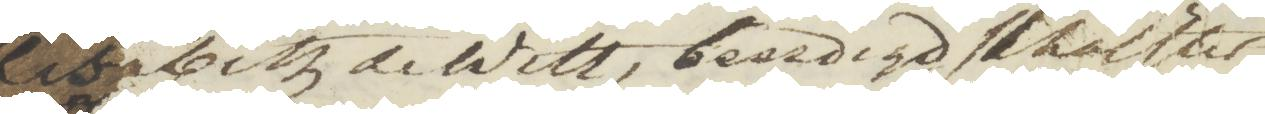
vrouw Elisabeth de Witt, beeedigd schatster
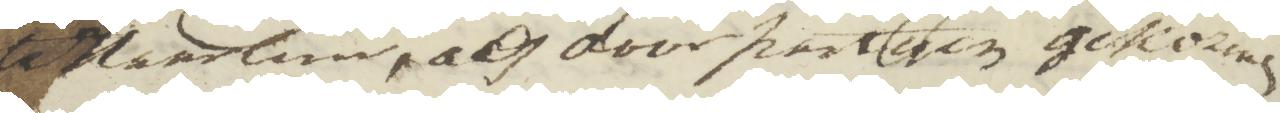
wonende te Haarlem, als door partyen gekozen
